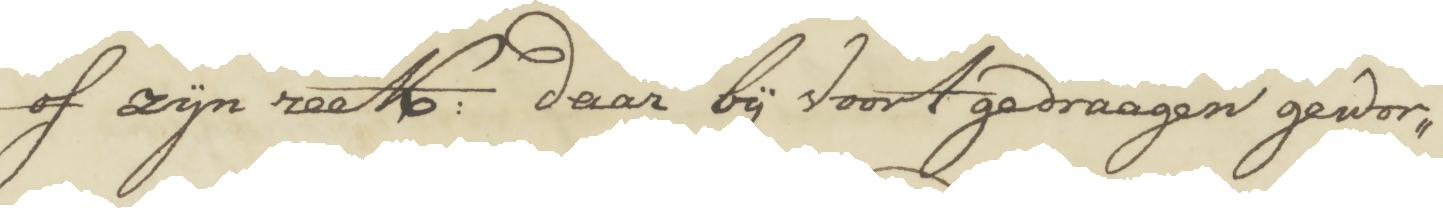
of zijn reek: daar bij voort gedraagen gewor„
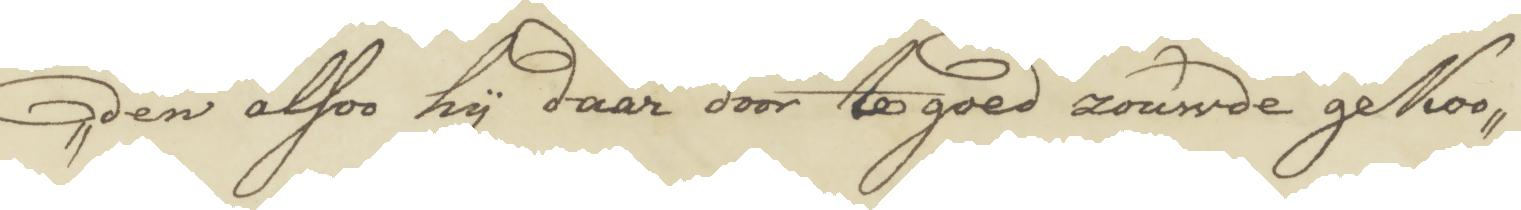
„den alsoo hij daar door te goed zouwde gekoo„
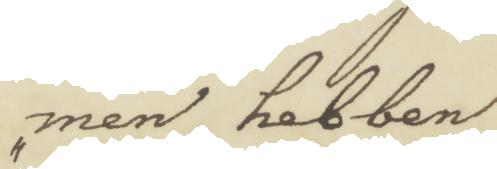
„men hebben
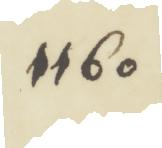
1160
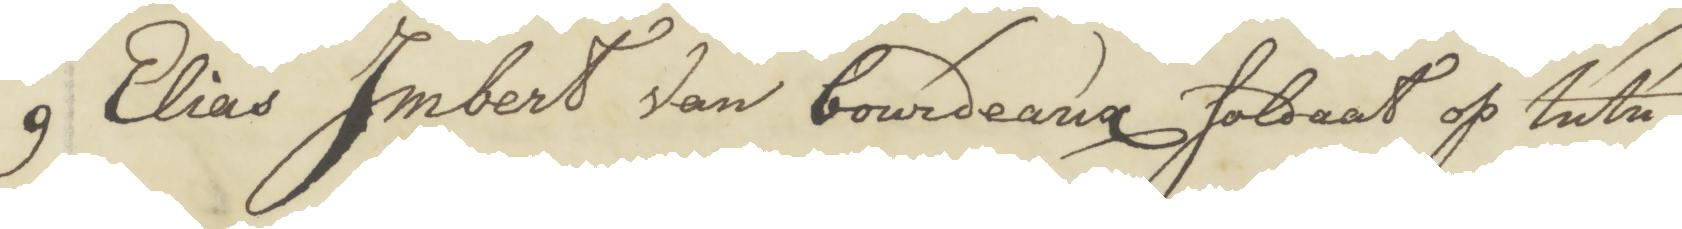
9 Elias Jmbert van bourdeaux soldaat op tutu
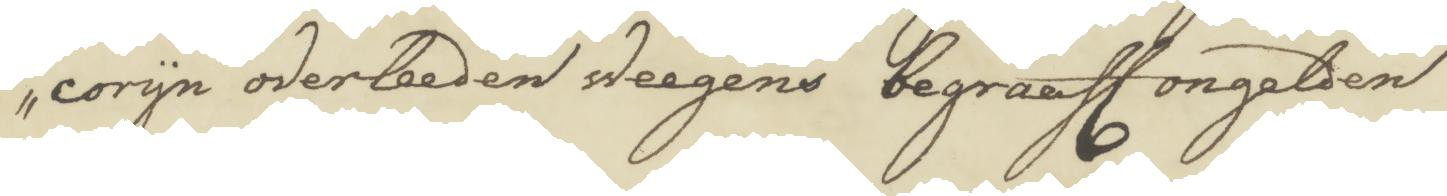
„corijn overleeden weegens begraaff ongelden
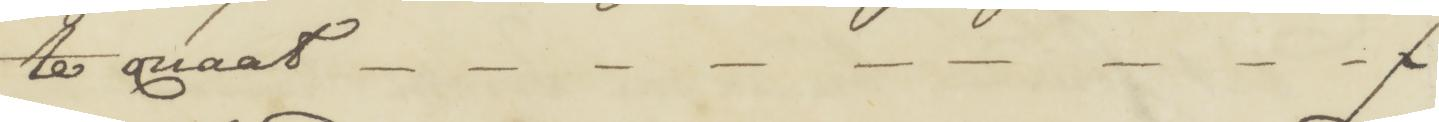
te quaat — — — — — — — — – ƒ
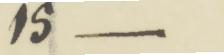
15 —
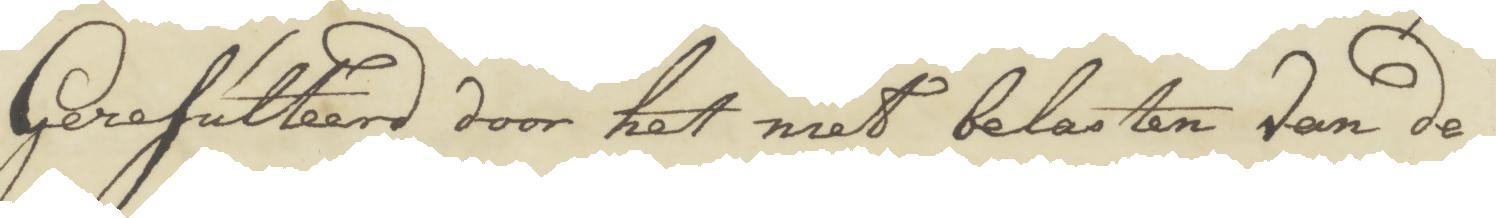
Geresulteerd door het niet belasten van de
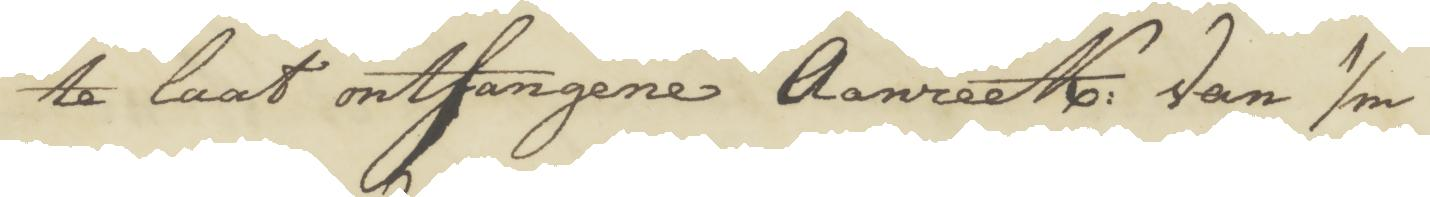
te laat ontfangene Aanreek: van 1/m
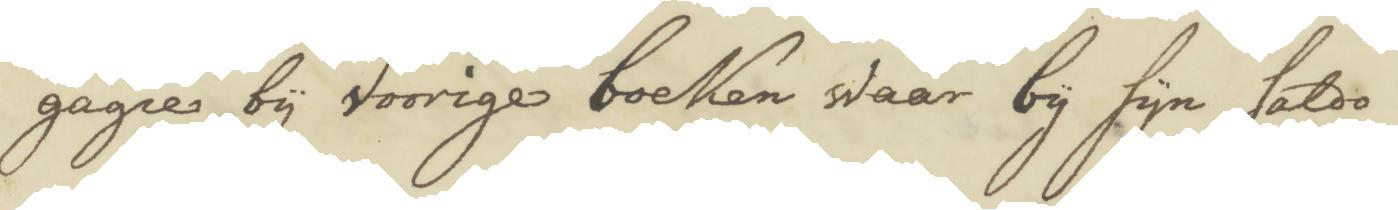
gagie bij voorige boeken waar bij sijn saldo
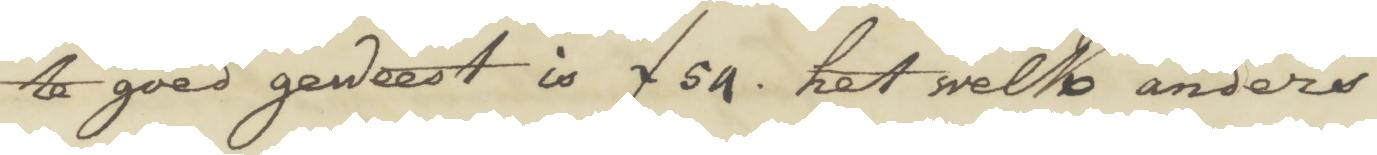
te goed geweest is ƒ 54. het welk anders
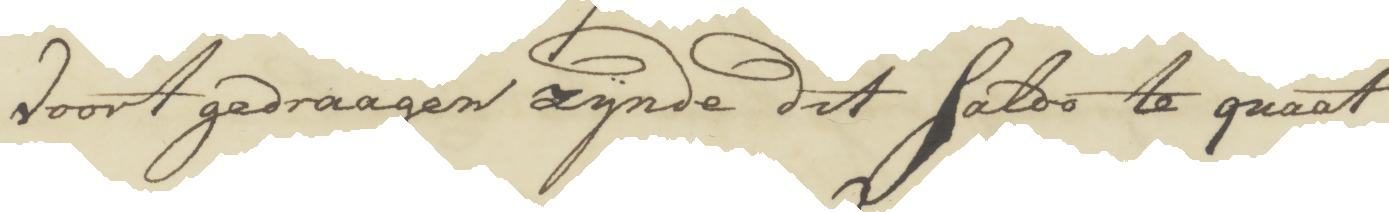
voort gedraagen zijnde dit saldo te quaat
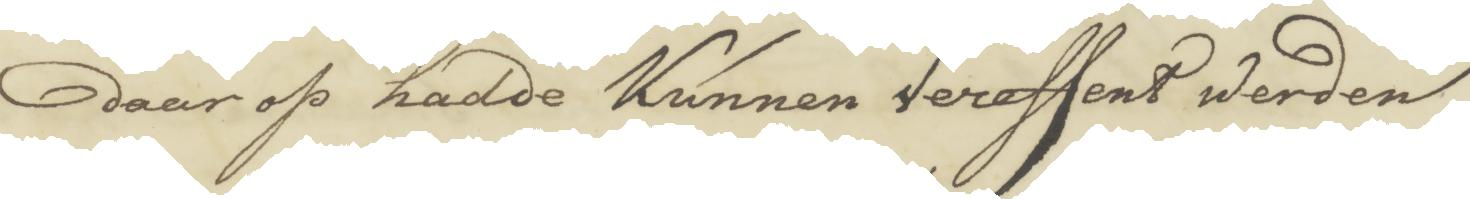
daar op hadde kunnen vereffent werden
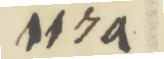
1174
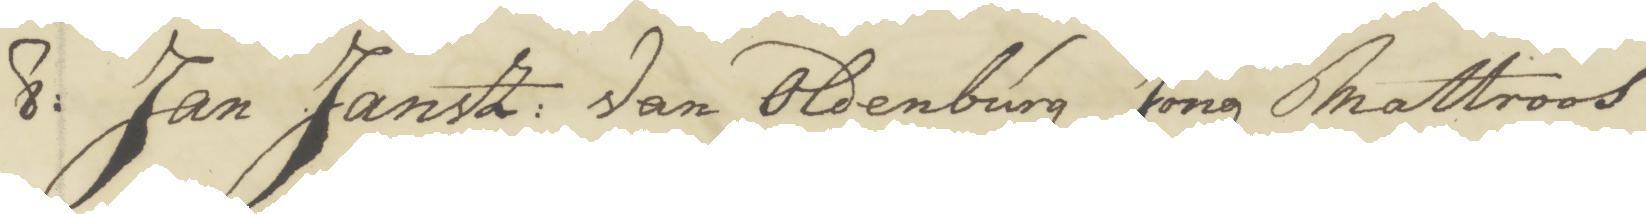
8. Jan Jansz: van Oldenburg Jong Mattroos
